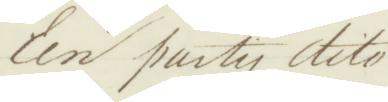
Een partij dito
